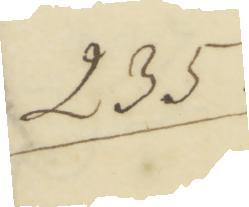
235.
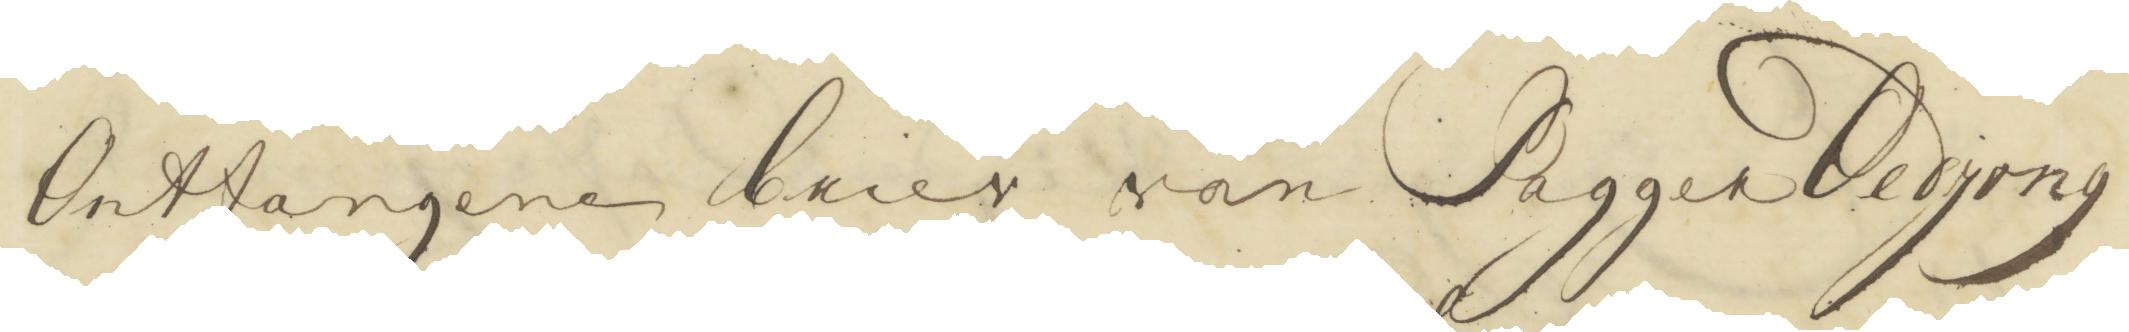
Ontfangene briev van Pagger Oedjong
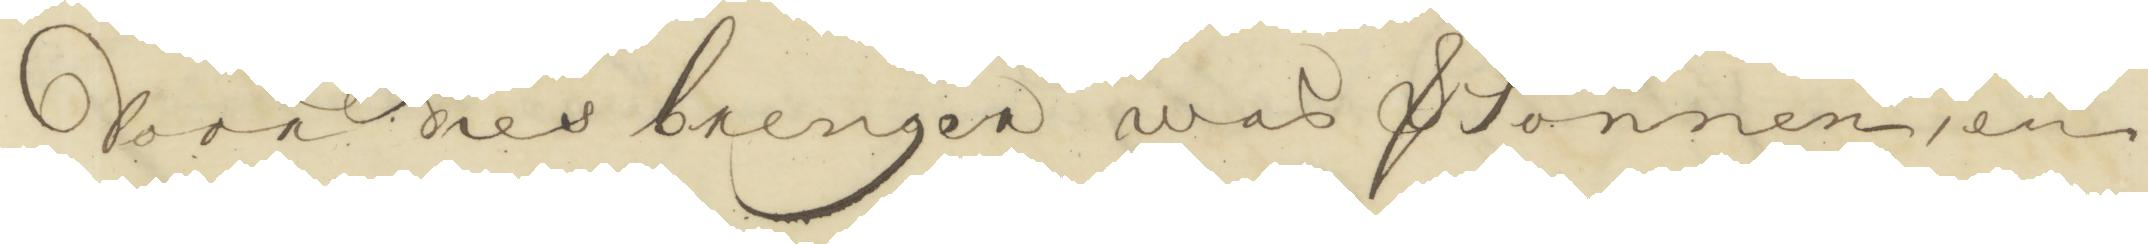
door dies brenger was versonnen, en
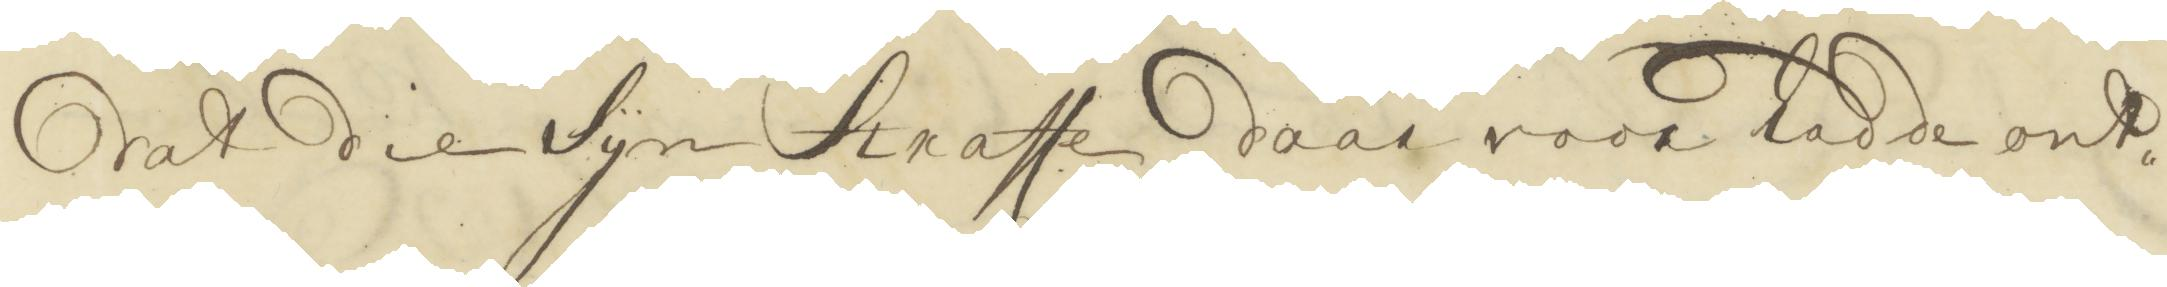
dat die sijn straffe daar voor hadde ont„
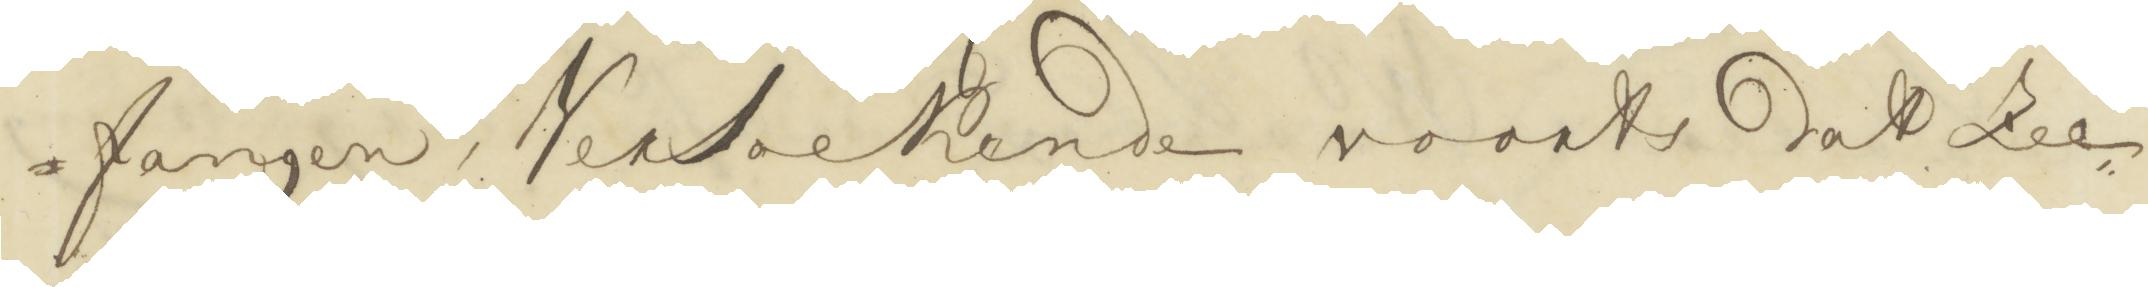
„fangen, Versoekende voorts dat zee„
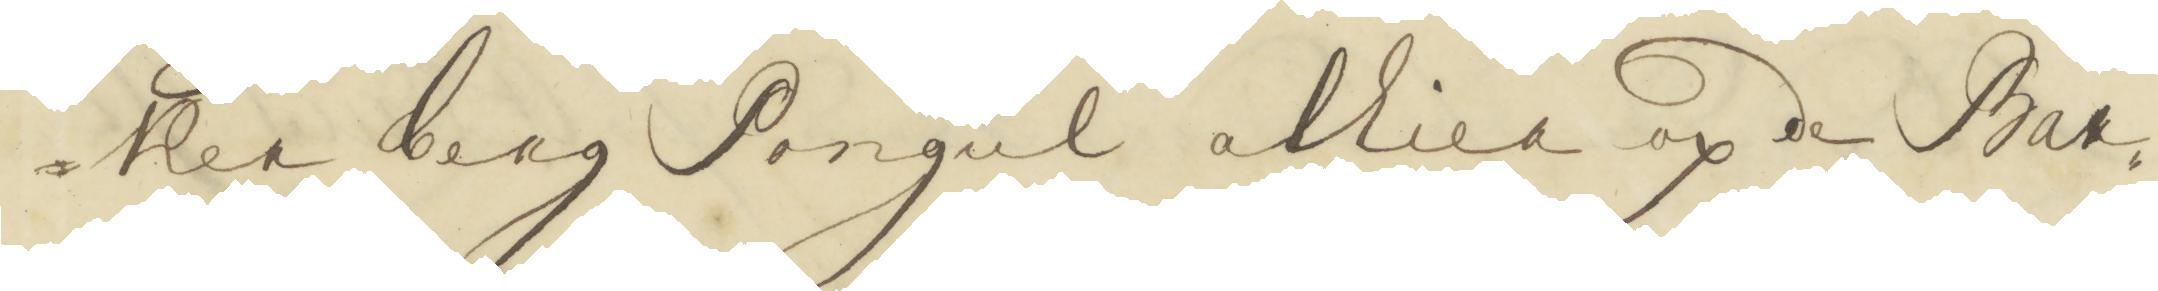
„ker berg Pongul alhier op de Bar„
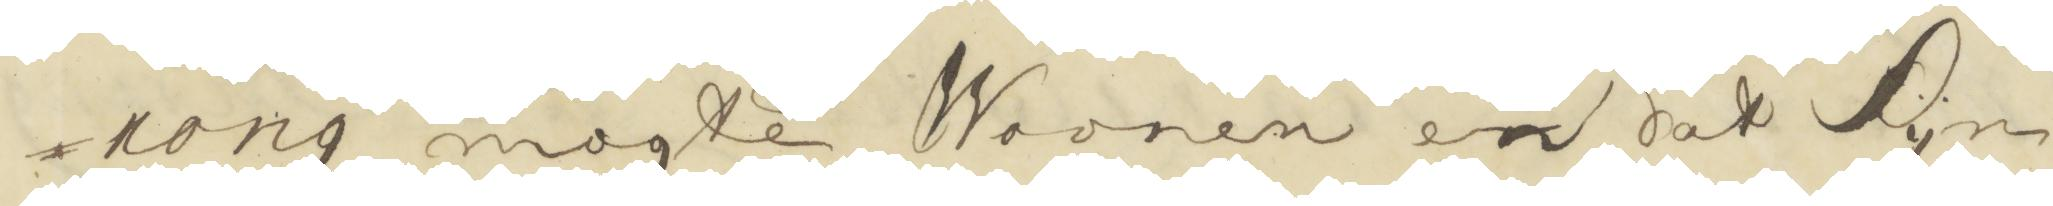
„rong mogte Woonen en dat sijn
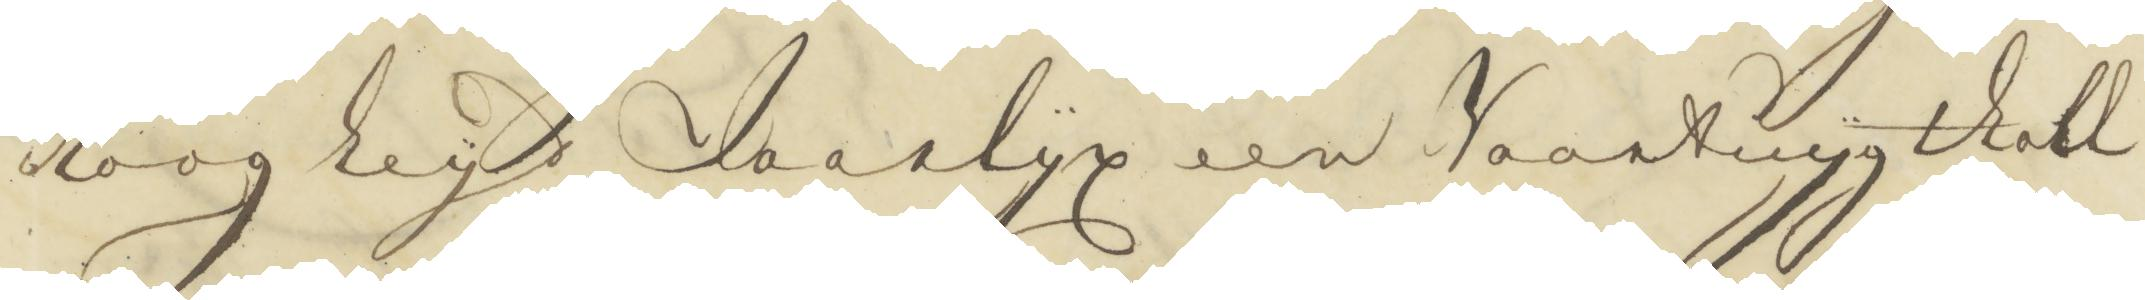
hoogheijd Iaarlijx een Vaartuijg tholl
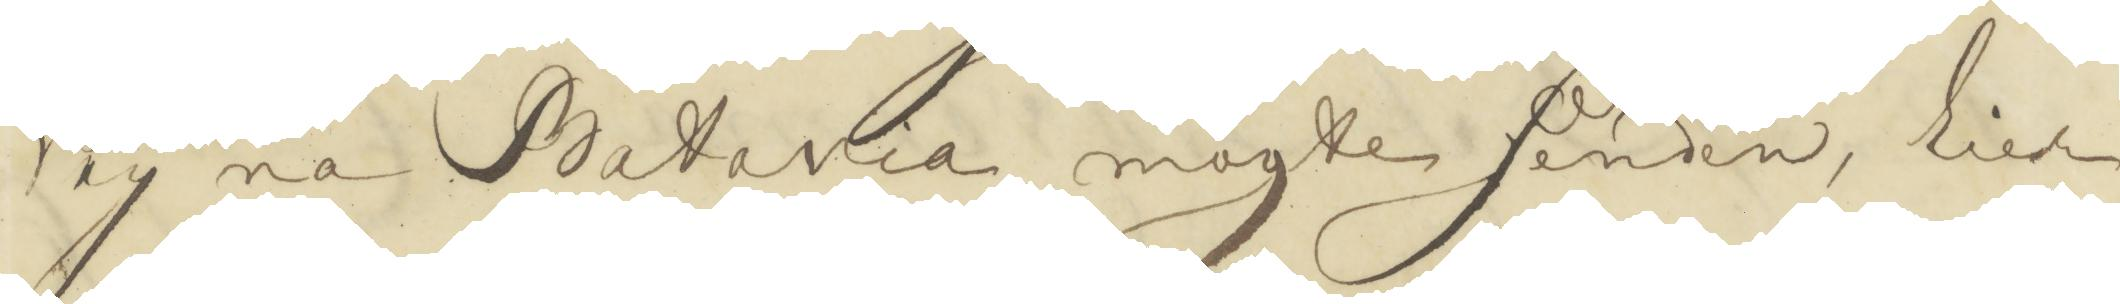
vrij na Batavia mogte senden, hier
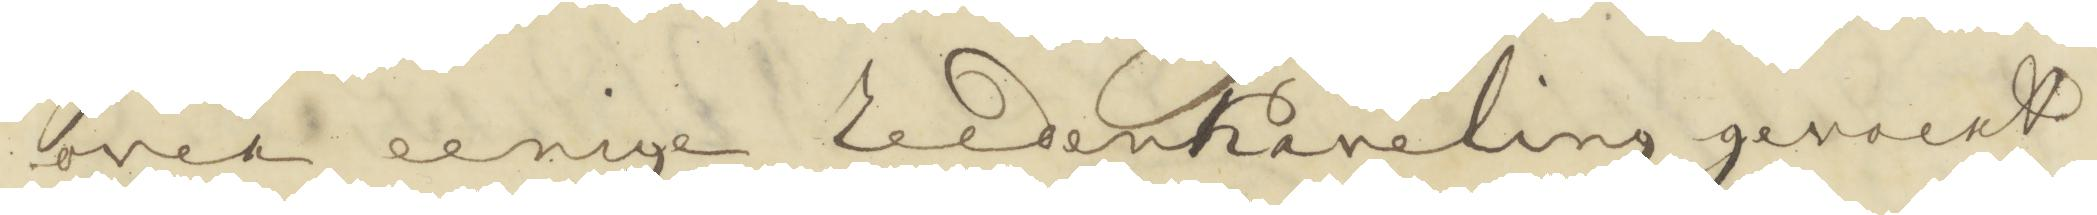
over eenige reedenkaveling gevoert
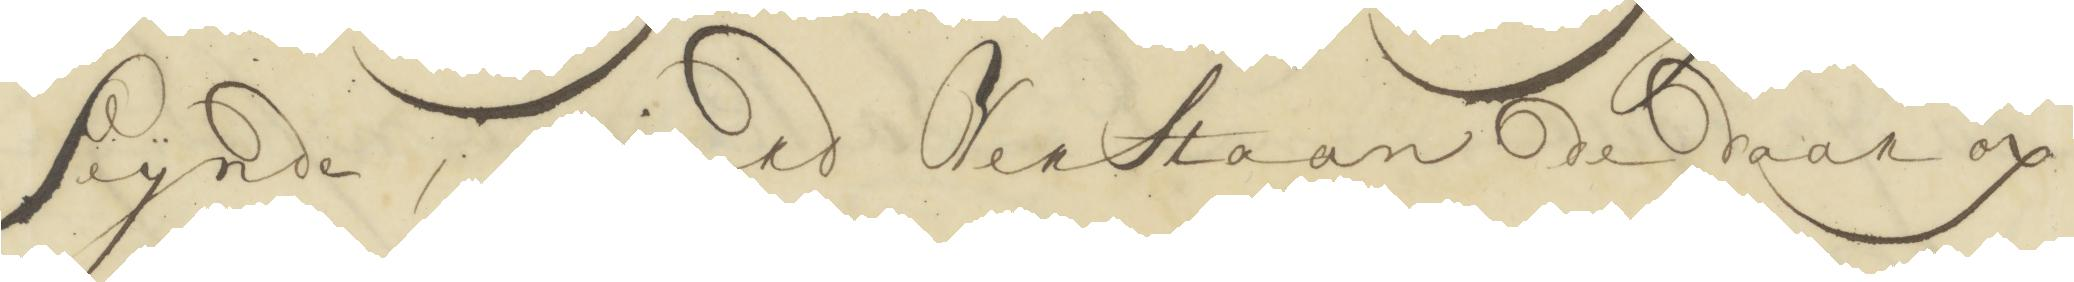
seijnde, wierd Verstaan de daar op
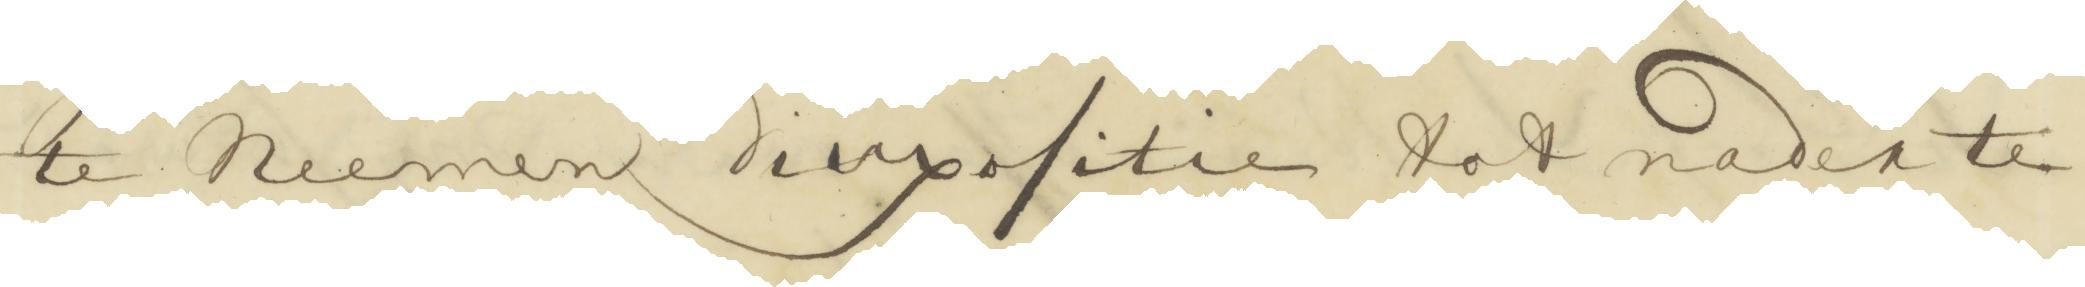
te neemen dispositie tot nader te
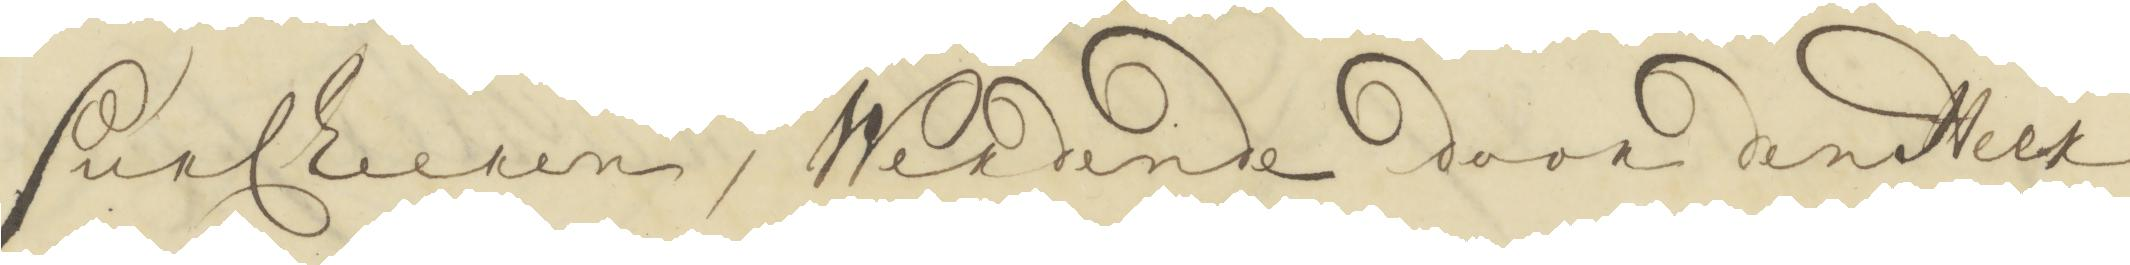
surcheeren, Werdende door den Heer
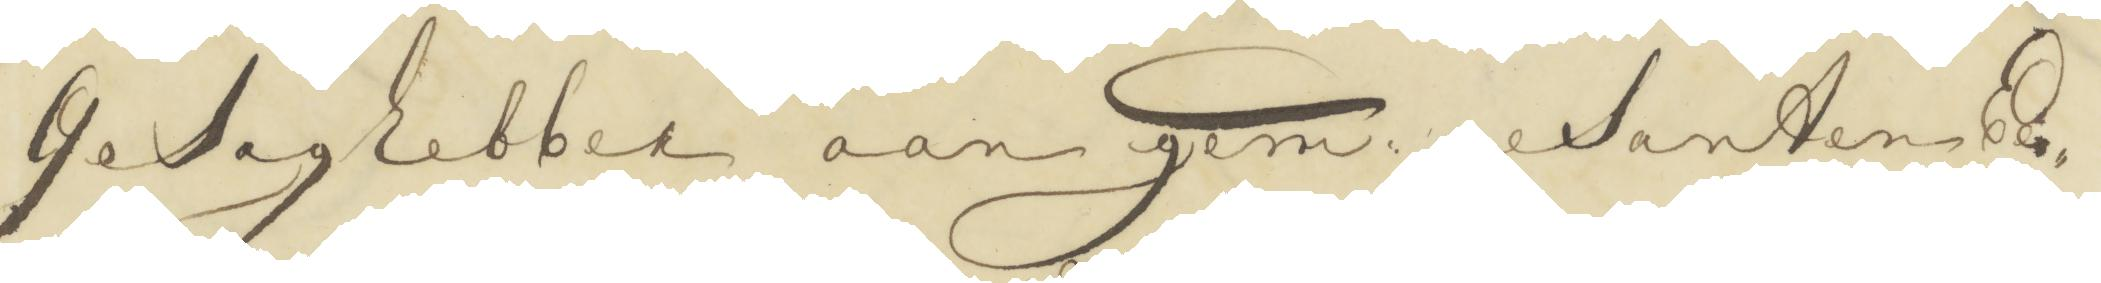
gesaghebber aan gem: gesanten Ee„
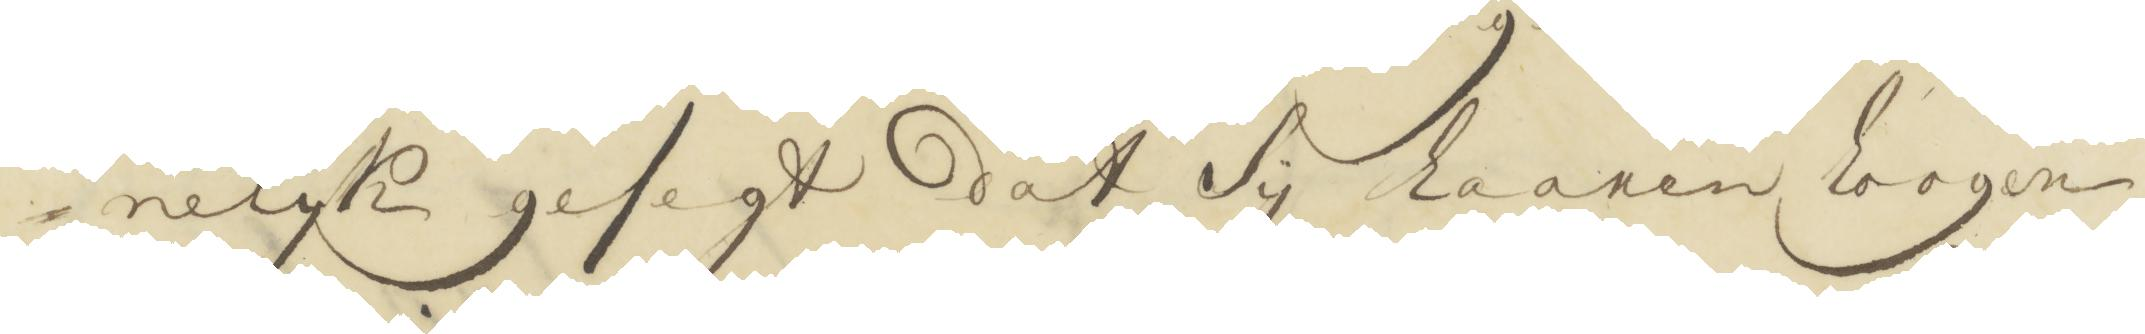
„relijk gesegt dat sij haaren hoogen
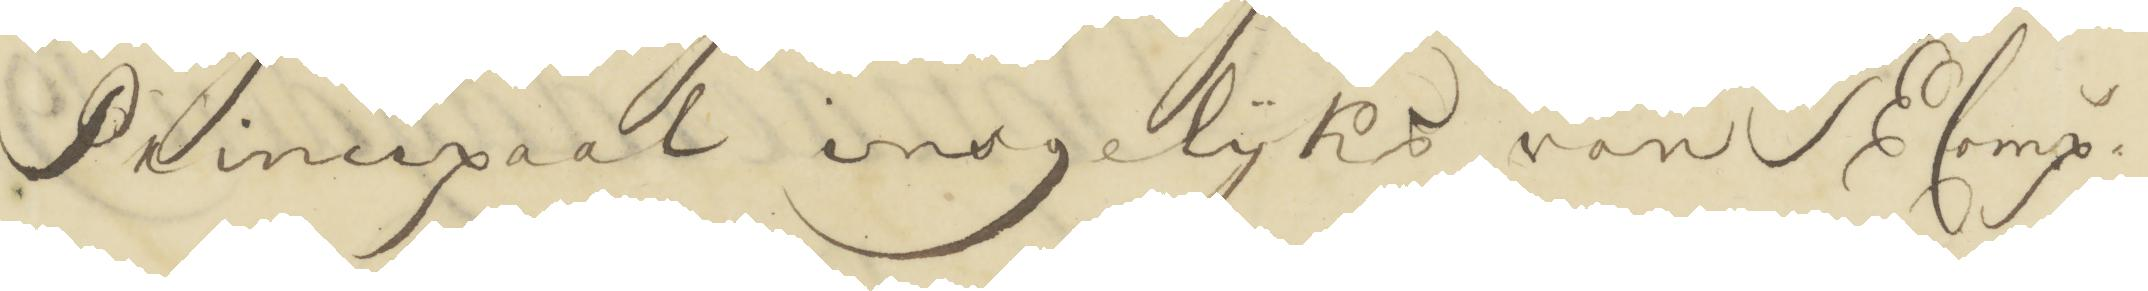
Principaal insgelijks van sEComp:s
